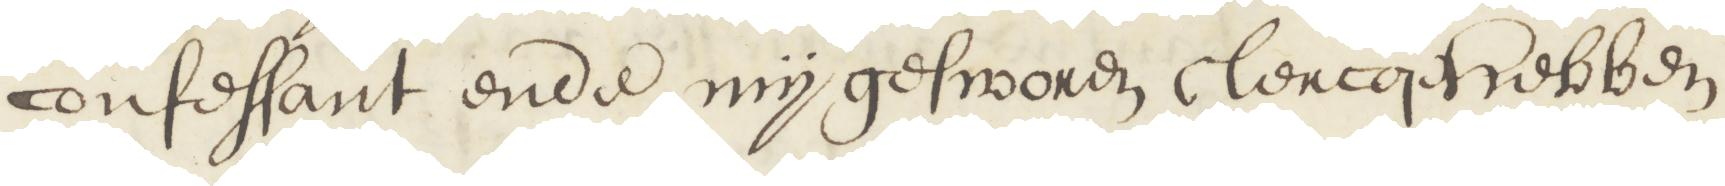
confessant ende mij gesworen clercq hebben
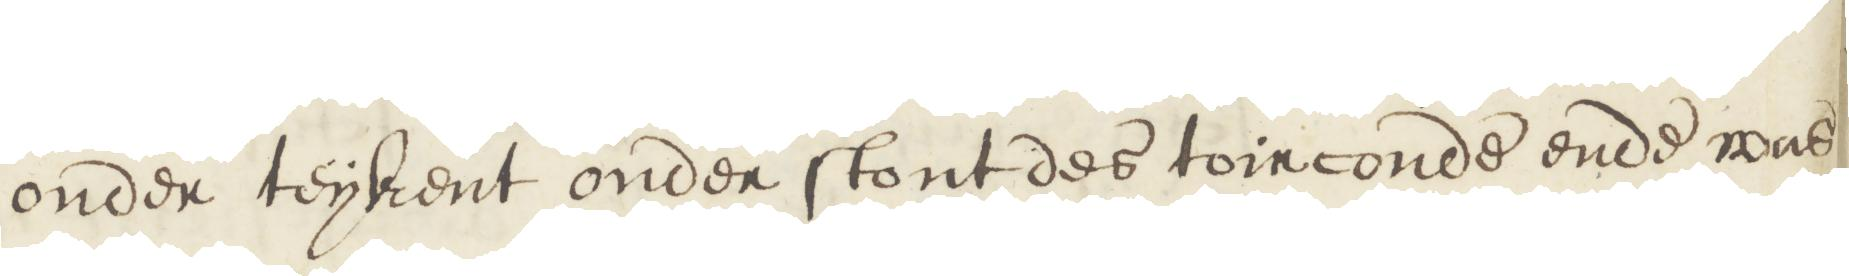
onder teijkent onder stont des toirconde ende was
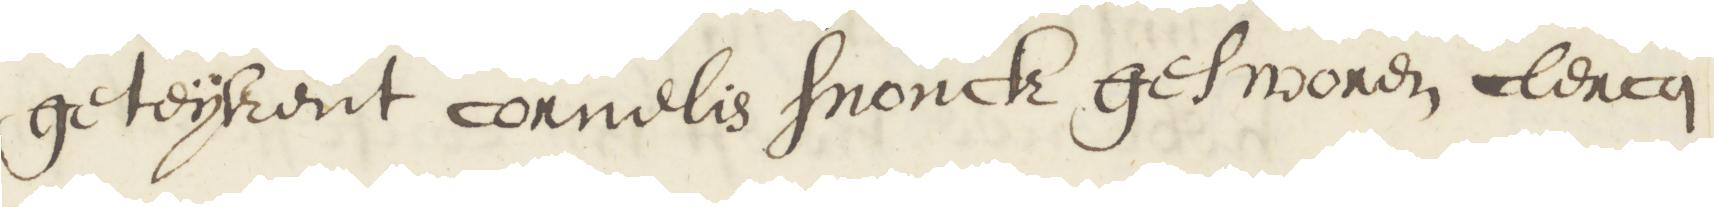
geteijkent cornelis snouck gesworen clercq
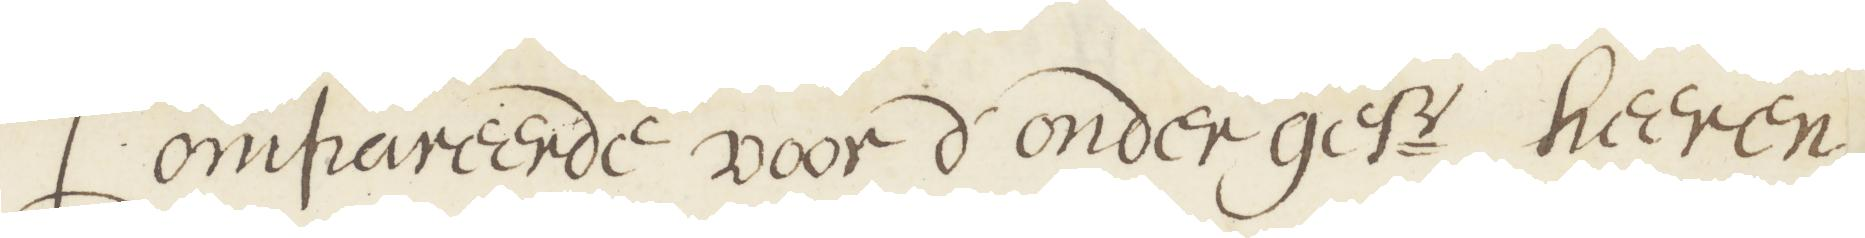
Compareerde voor d’ onder ges= heeren
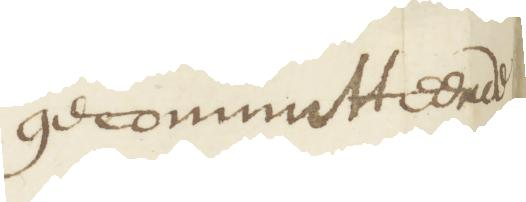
gecommitteerde
